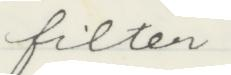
filter
